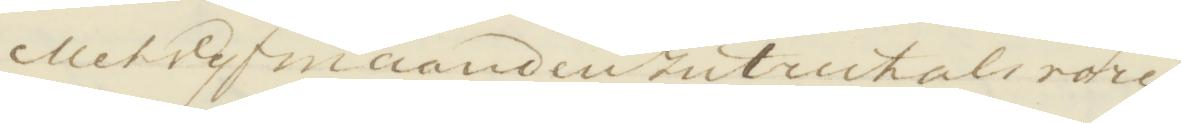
Met vyf maanden Intrest als voren
